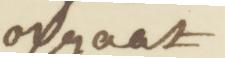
overgaat
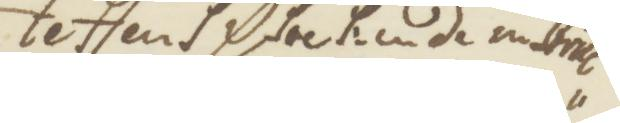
teffens versoekende instruc„
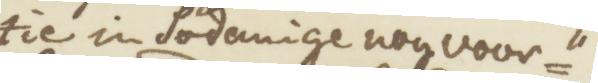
tie in sodanige nog voor=
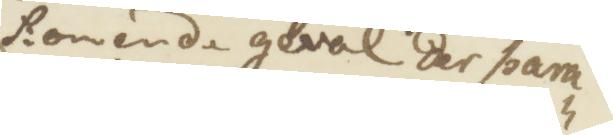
komende geval der para„
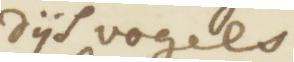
dijs vogels
